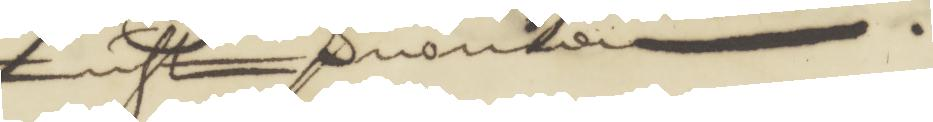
cust vernomen.
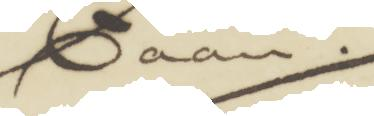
'T aan./.
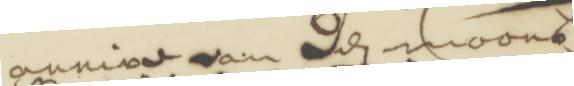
arrive van Een moors
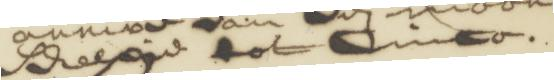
scheepje tot cinco.
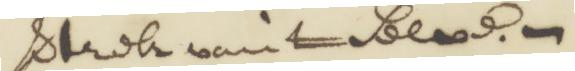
vertrek van ’t selve.-
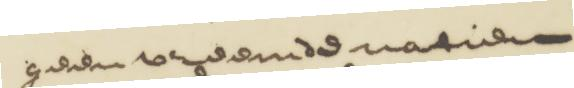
geen vreemde natien
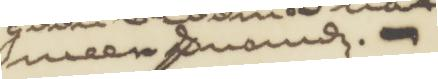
meer vernomen. -
